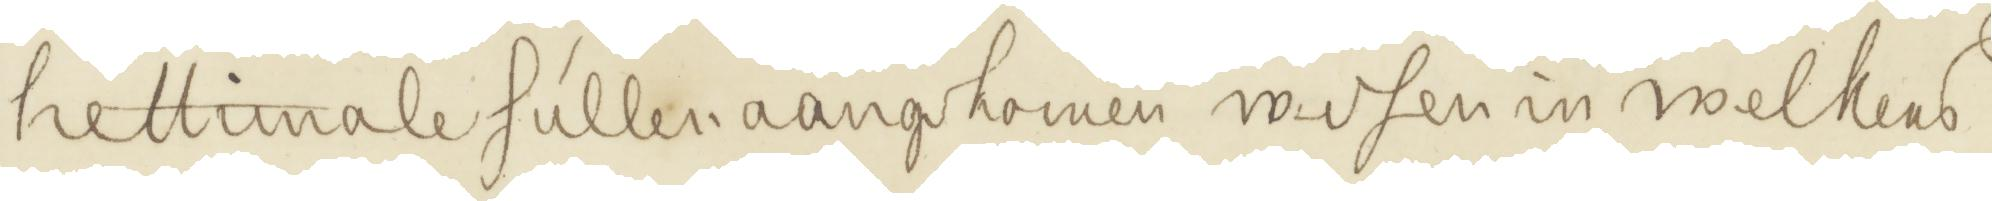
hettimale sullen aangekomen wesen in welkers
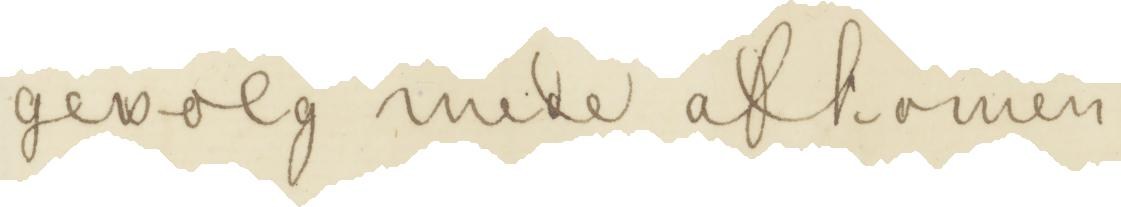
gevolg mede afkomen
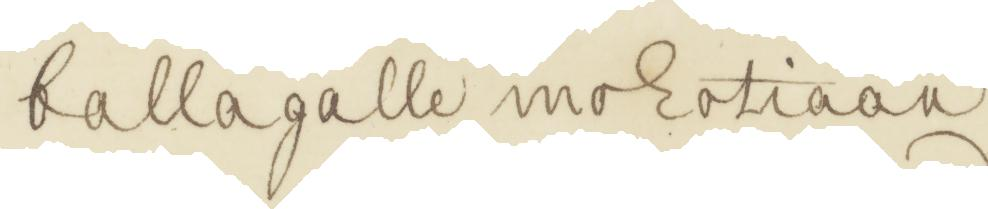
ballagalle mohotiaar
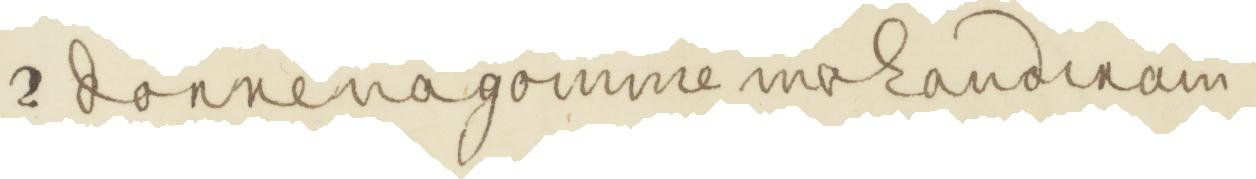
2 dorrenagomme mohandiram
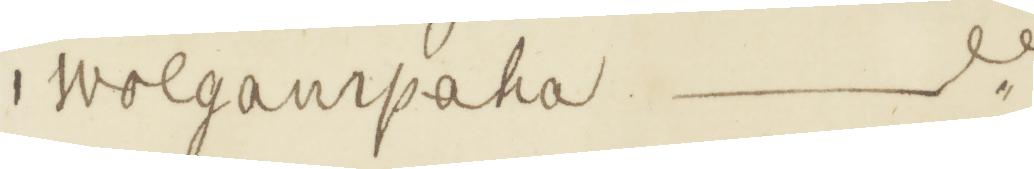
1 wolgampaka d„o
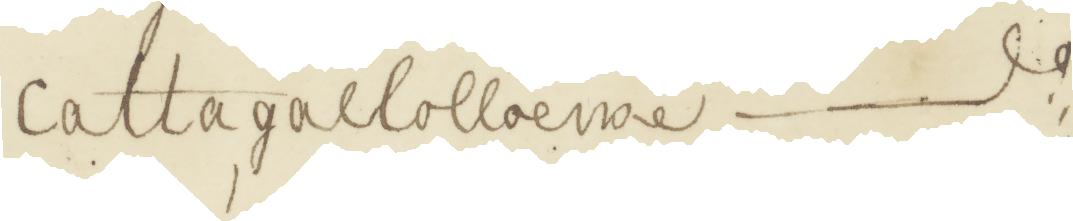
Catta gallolloewe d„o
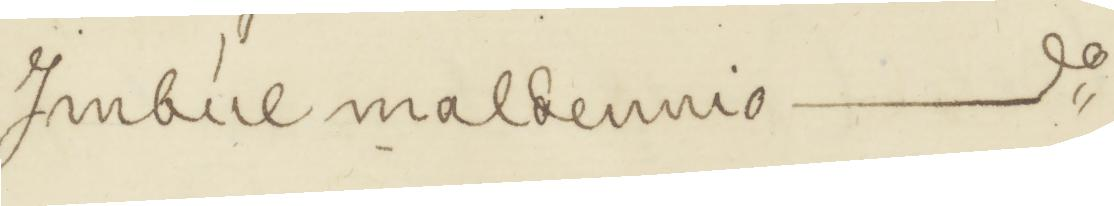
Jmbul maldennio d„o
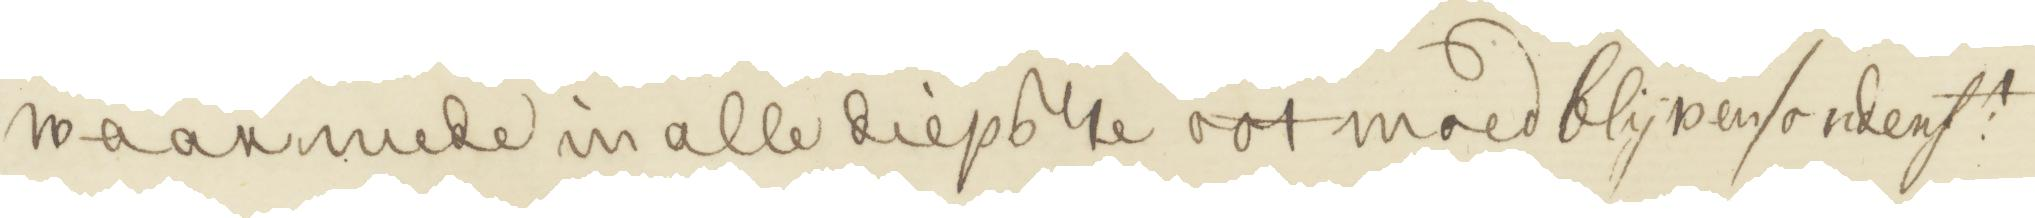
waarmede in alle diepste oot moed blijven/ onders:t
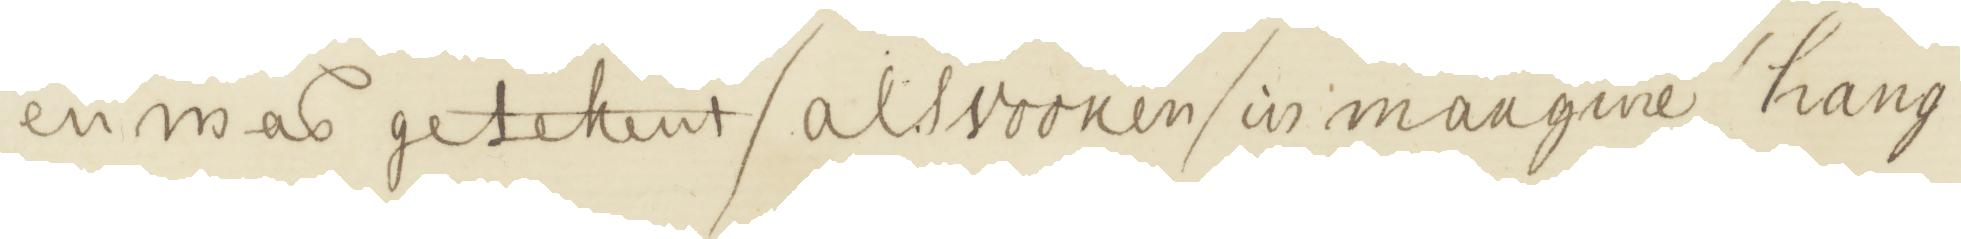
en was getekent / als vooren / in margine 'hang
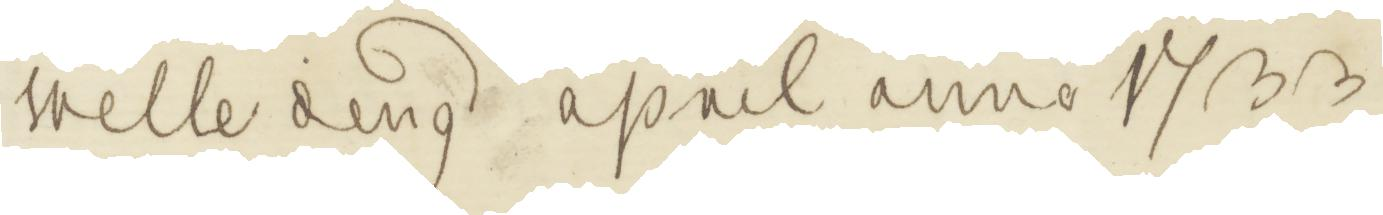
welle den 9' april anno 1733
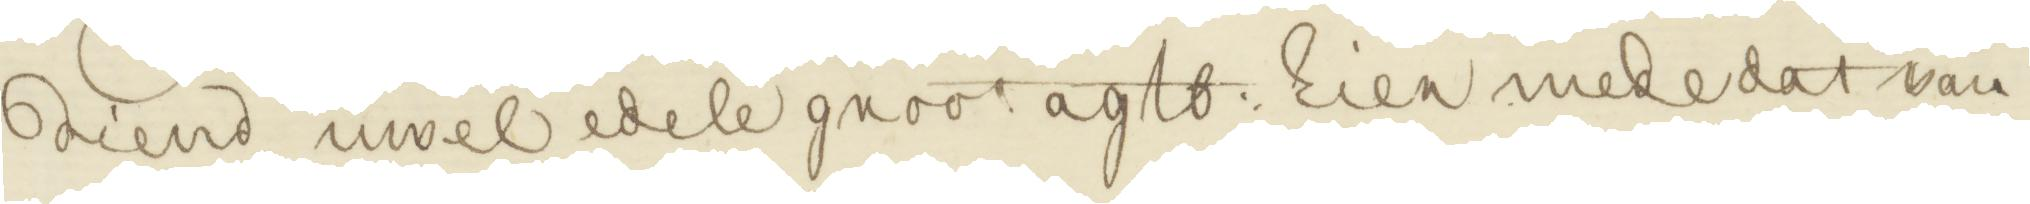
diend uwel edele groot agtb: hier mede dat van
